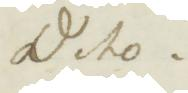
Dito. . . . . . . .
